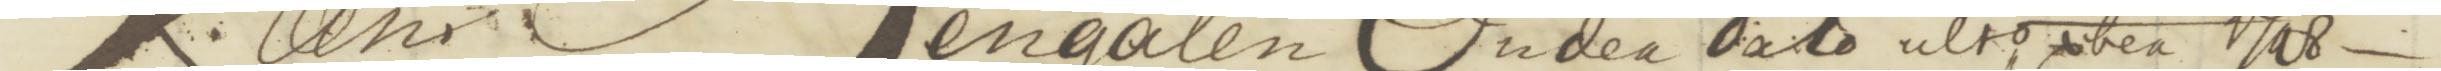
Van Bengalen Onder dato ult„o xber 1748 —
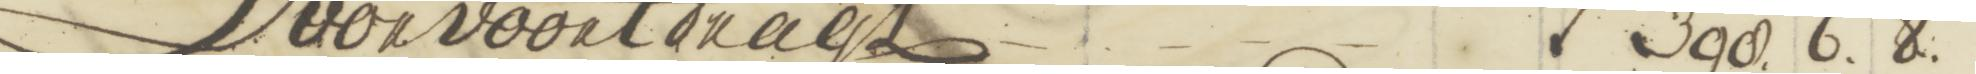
Door voortdragt - . . - - - ƒ 398. 6. 8:
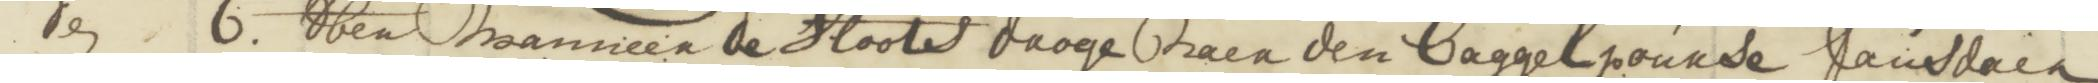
den 6. 8ber wanneer de vloots droge naer den baggel pourse fausdaer
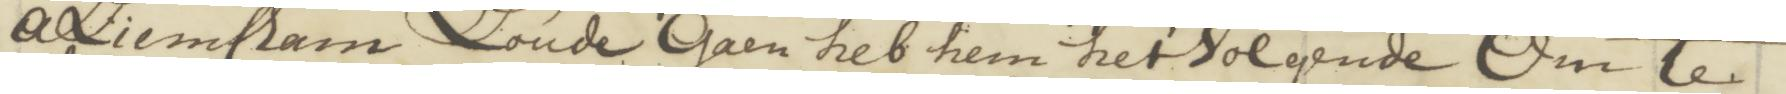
aziemcham zoude Gaen heb hem het volgende Om te
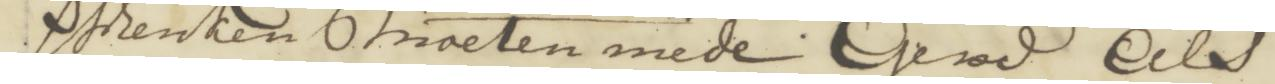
verschenken moeten mede Geve Als
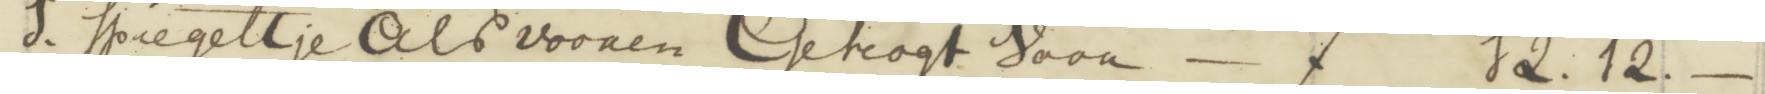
1. spiegeltje Als vooren Gekogt voor - ƒ 12: 12. —
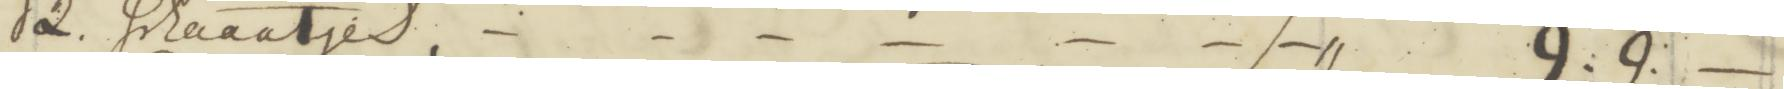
12. schaartjes - - - - - - - „ 9: 9: —
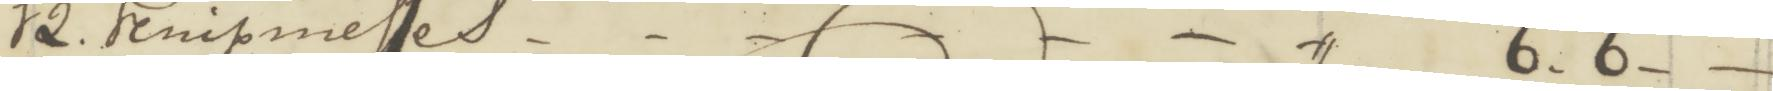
12. knipmesjes „ 6. 6 — —
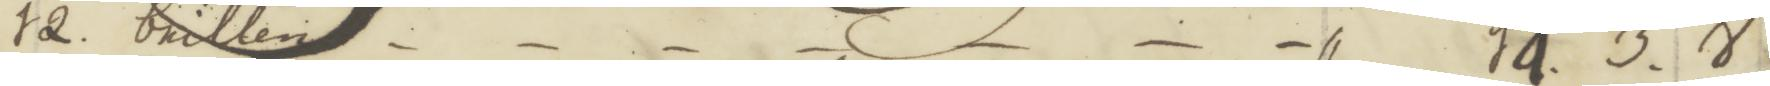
12. brillen - - - - - - - „ 14. 3. 8
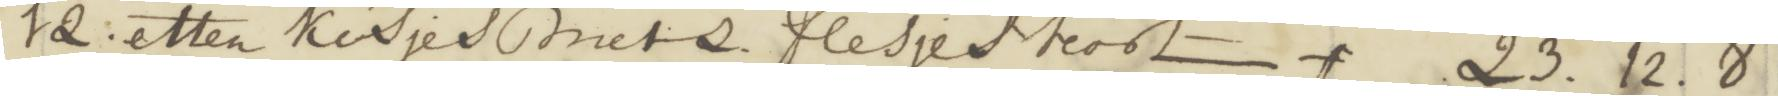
12. etten kisjes met 2. flesjes kost - „ 23. 12. 8
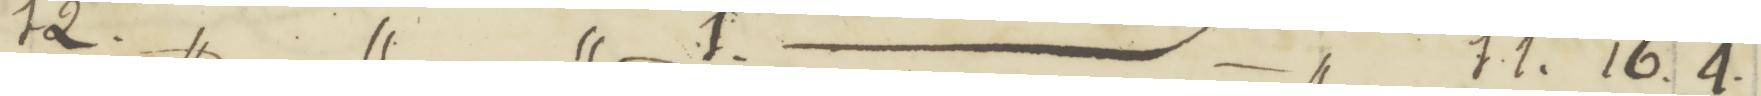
12. „ „ „ 1. D-o „ 11. 16. 4.
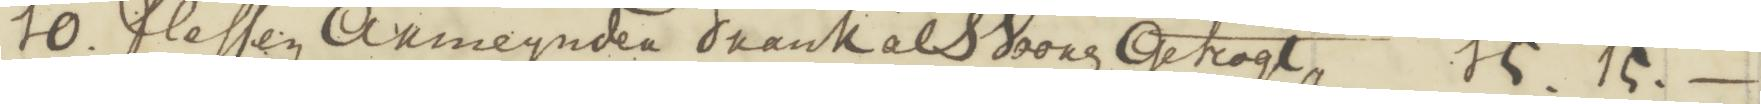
10. flessen Armeynder drank als vooren Gekogt „ 15. 15. —
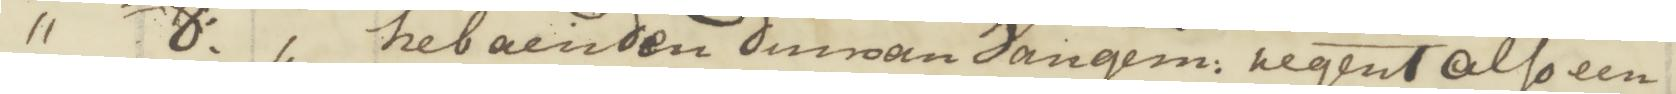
„ 8: „ heb aen den d'invan van gem: regent als een
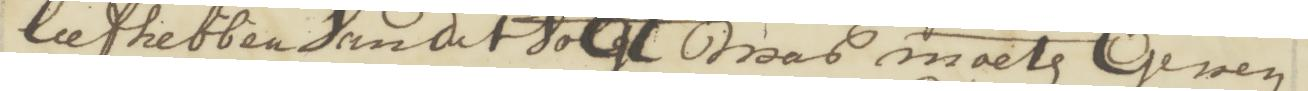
liefhebber van dit vogt was moeten Geven
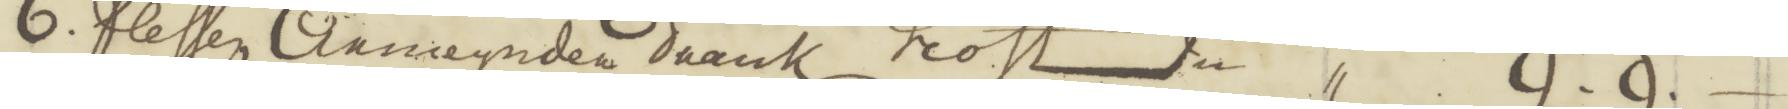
6. flessen Armeynder drank kosten „ 9. 9. —
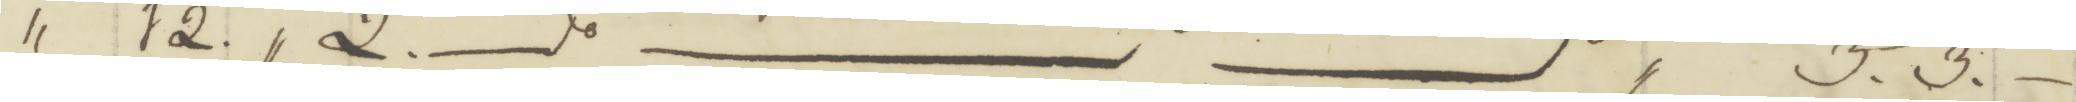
„ 12. „ 2. Do Do Do „ 3. 3. —
